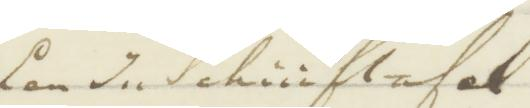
Een Inschuiftafel
